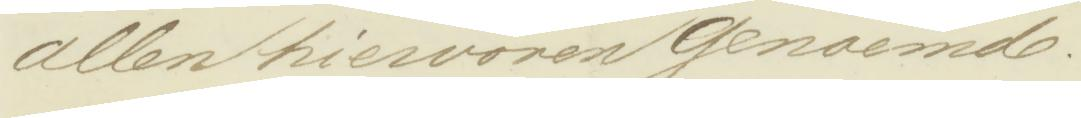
allen hiervoren genoemde.
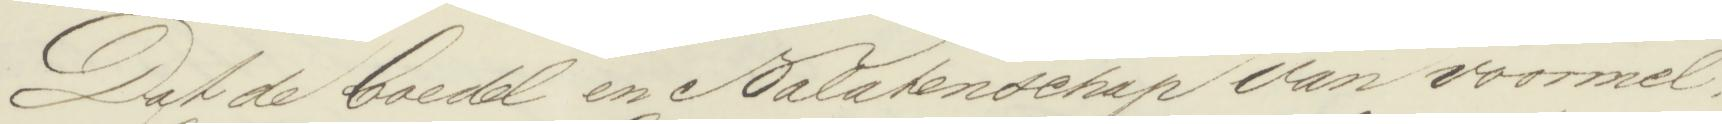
Dat de boedel en Nalatenschap van voormel
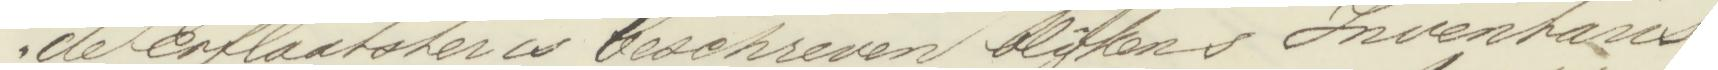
„de Erflaatster is beschreven blijkens Inventaris
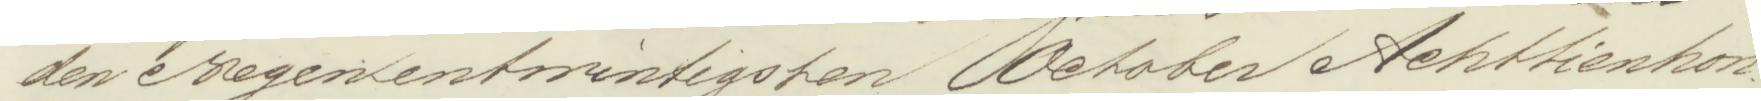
den Negen entwintigsten October Achttienhon
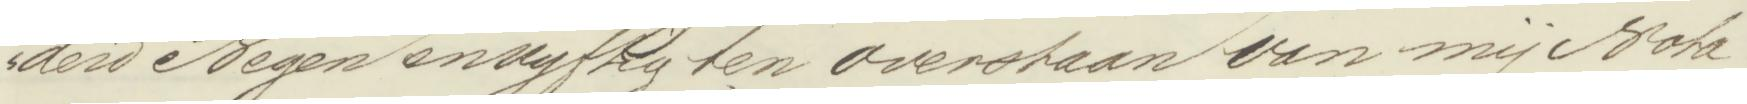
„derd Negen envijftig ten overstaan van mij Nota
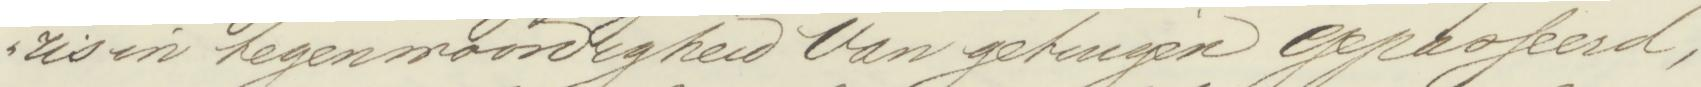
„ris in tegenwoordigheid van getuigen gepasseerd,
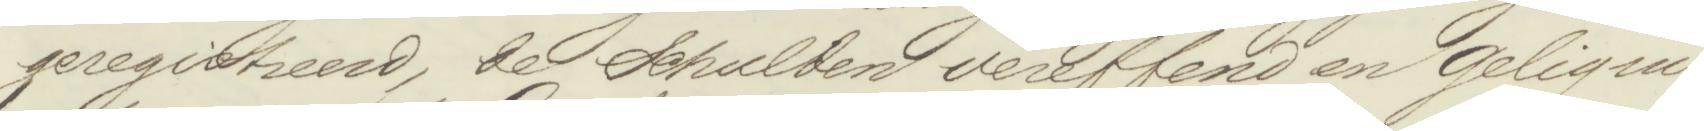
geregistreerd, de schulden vereffend en geliqui
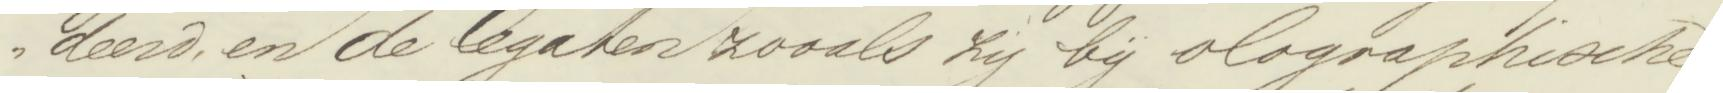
„ deerd, en de legaten zoo als zij bij olographische
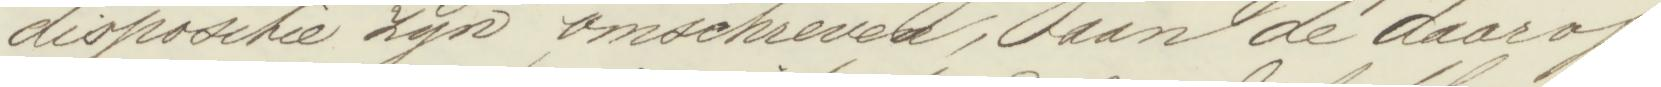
dispositie zijn omschreven, aan de daarop
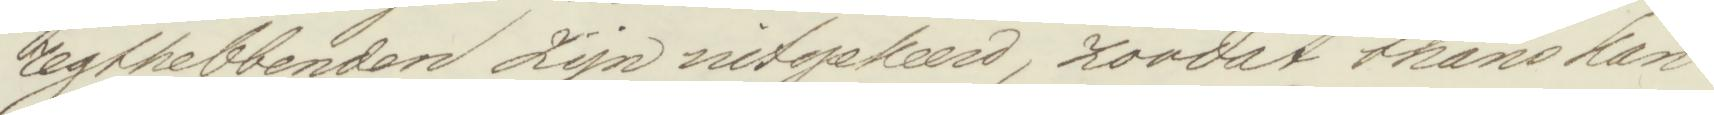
regthebbenden zijn uitgekeerd, zoodat thans kan
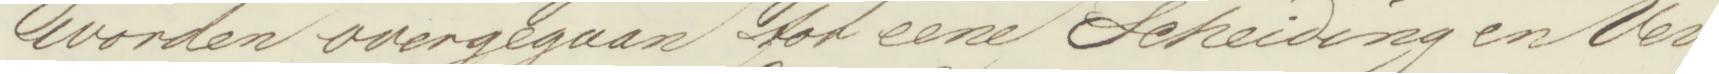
worden overgegaan tot eene scheiding en Ver
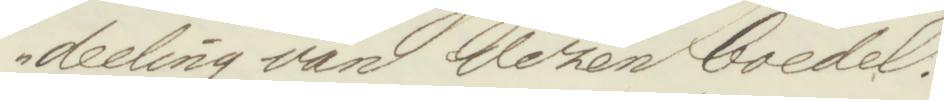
„deeling van dezen boedel.
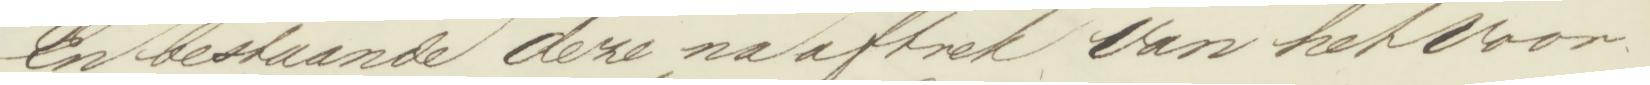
En bestaande deze na aftrek van het voor
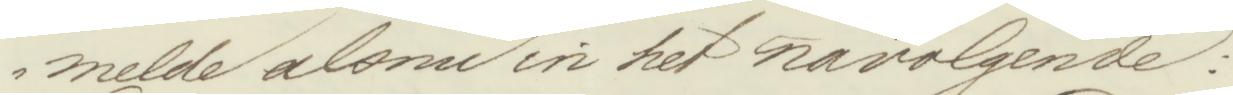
„melde alsnu in het navolgende:
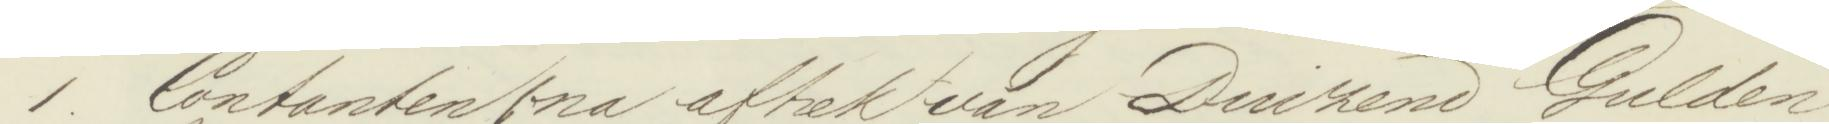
1. Contanten (na aftrek van Duizend Gulden
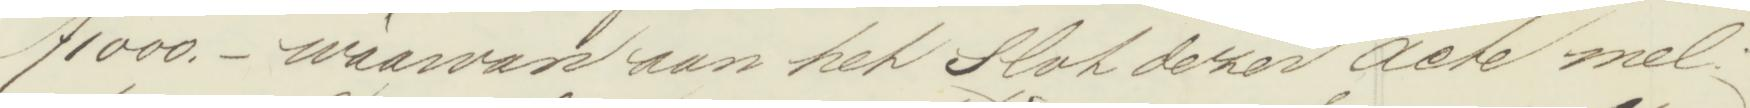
ƒ1000. - waarvan aan het slot dezer Acte mel.
